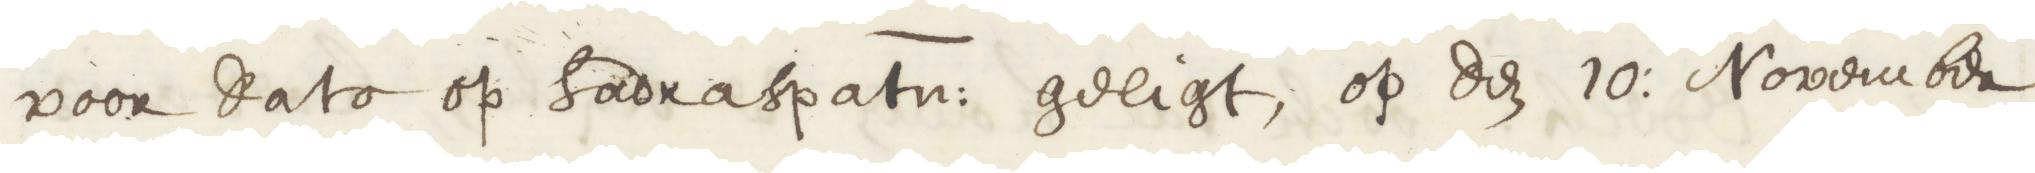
voor dato op sadraspatn: geligt; op den 10: November
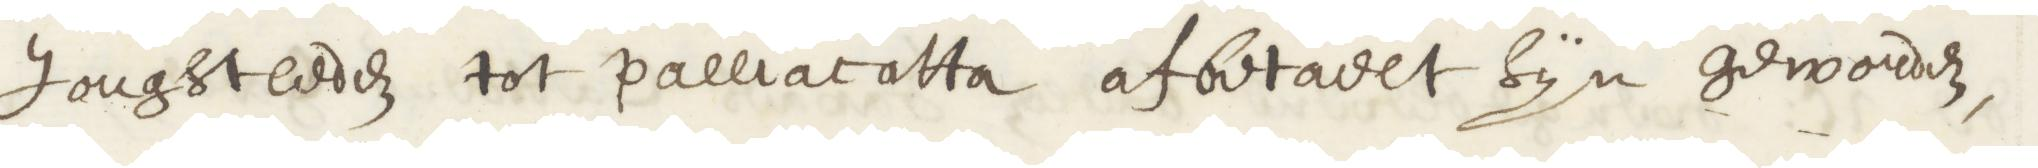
Iongstleden tot palliacatta afbetaelt sijn geworden,
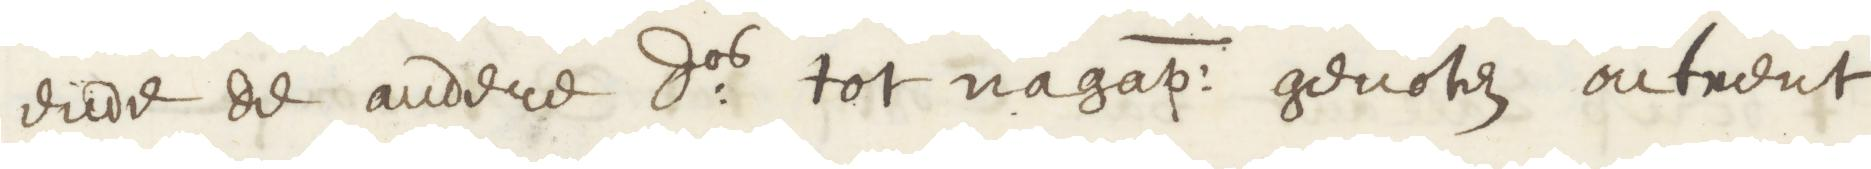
ende de andere d:os tot nagap: genoten ontrent
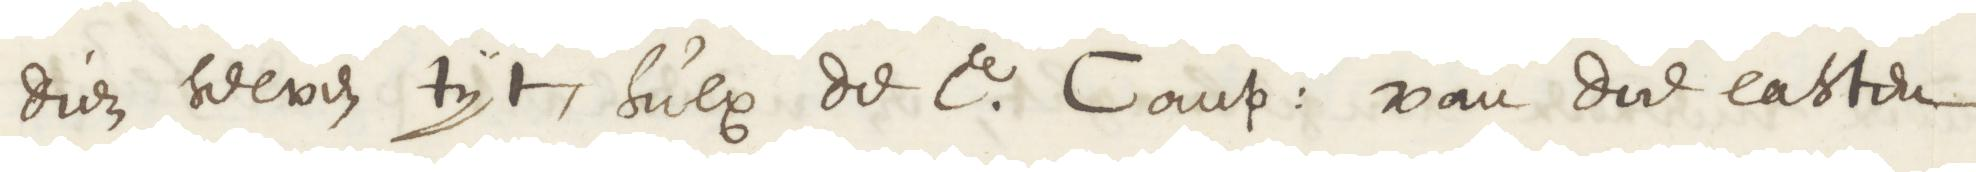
dien selven tijt, sulx de E.e Comp:' van die lasten
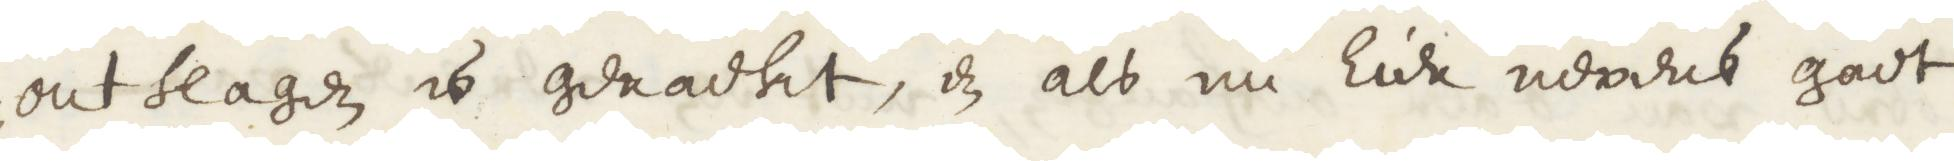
ontslagen is geraekt, en als nu hier nevens gaet
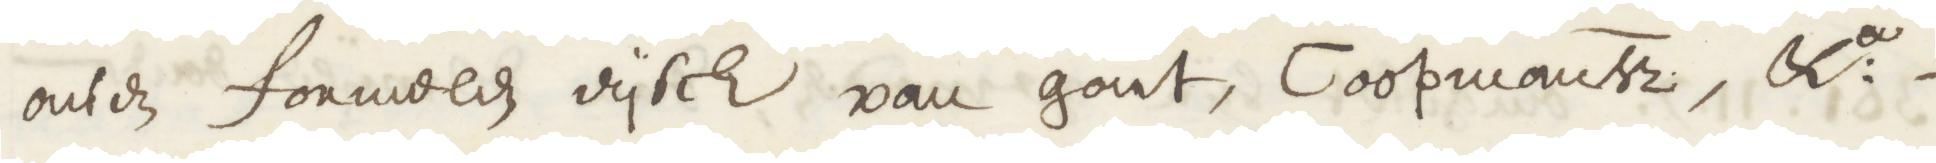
onsen formelen eijsch van gout, Coopmansz:, Et:a
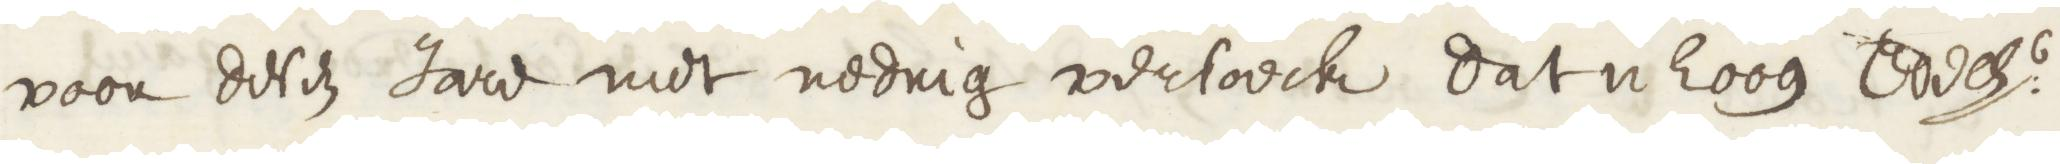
voor desen Iare met nedrig versoeck dat u hoog Edelh:s
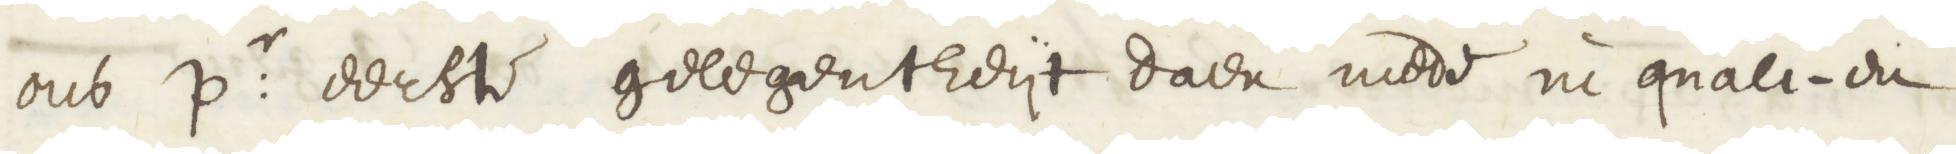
ons p:r eerste gelegentheijt daer mede in quali-en
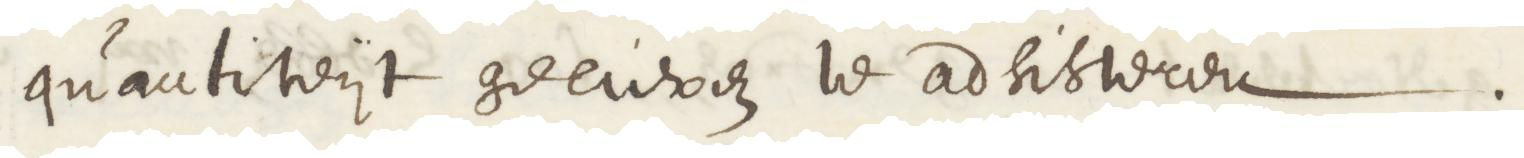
quantiteijt gelieven te adsisteren
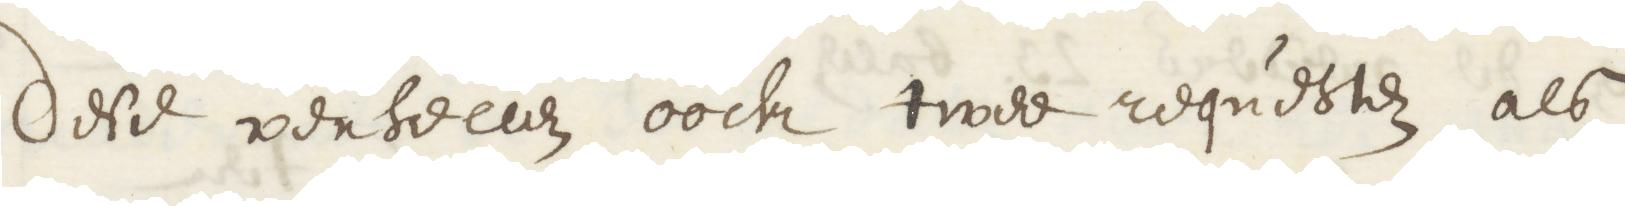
dese versellen oock twee requesten als
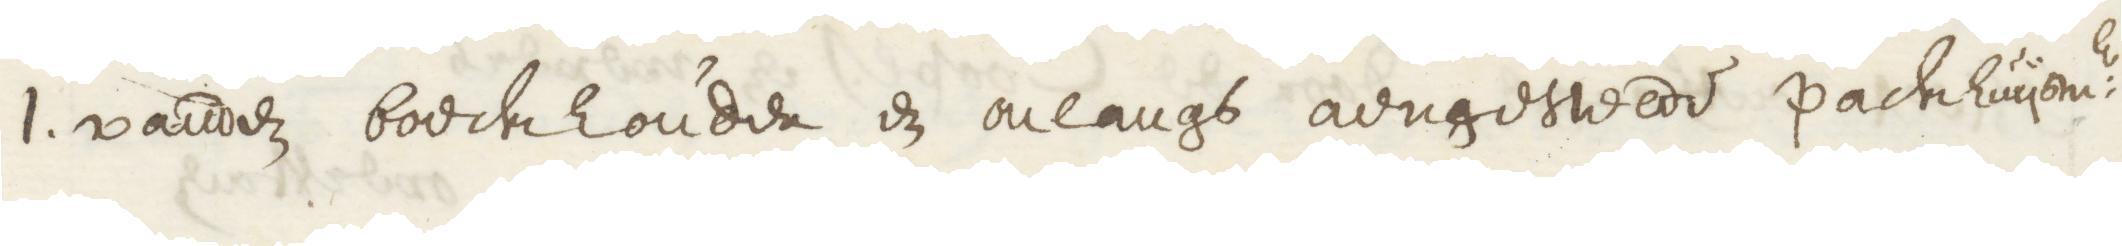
1. vanden boeckhouder en onlangs aengestelde packhuijsm:r
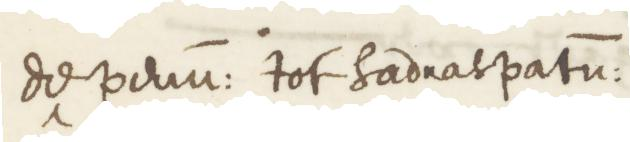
de penn: tot sadraspatn:
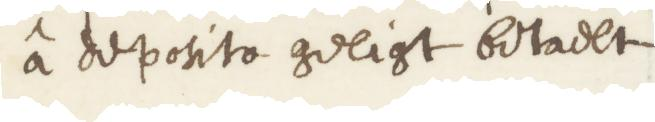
â deposito geligt betaelt
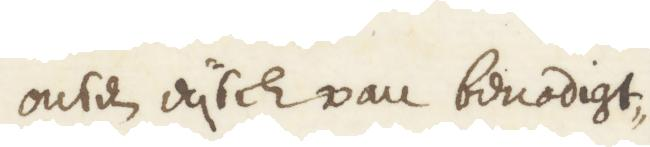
onse eijsch van benodigt„
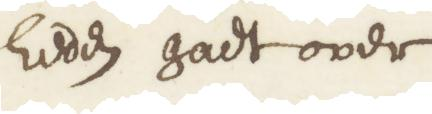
heden gaet over
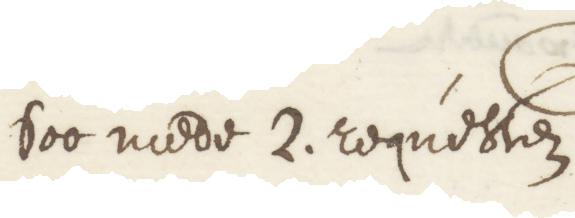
soo mede 2. requesten
